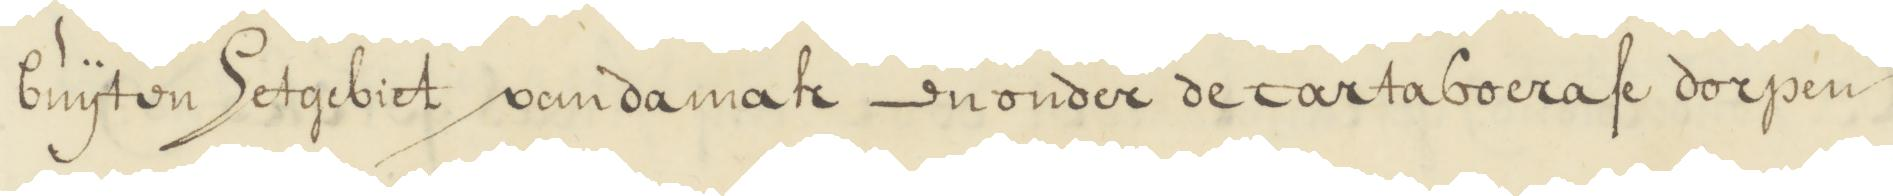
buijten hetgebiet van damak en onder de cartaboerase dorpen
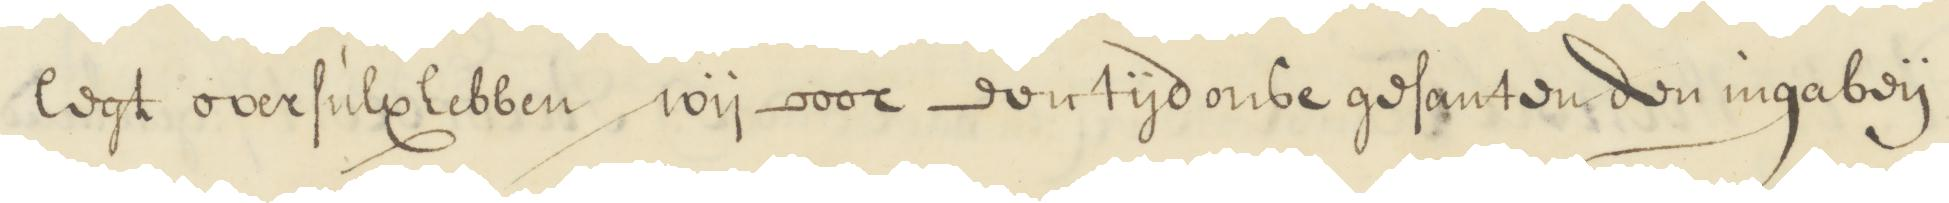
legt oversulxhebben wij voor een tijd onse gesanten den ingabeij
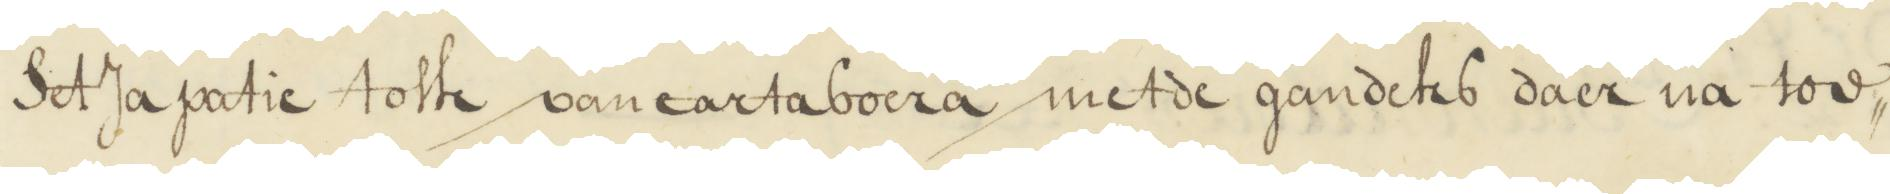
het Ja patie tolk van cartaboera met de gandeks daer na toe„
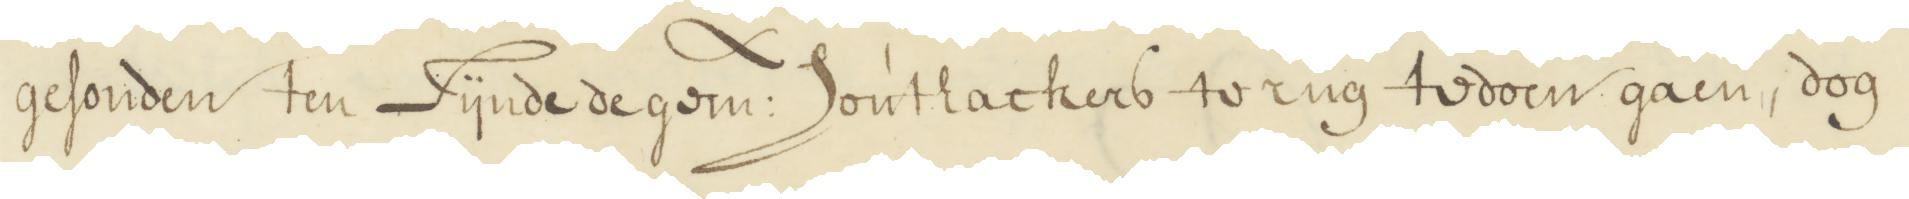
gesonden ten Eijnde de gem: houthackers te rug te doen gaen, dog
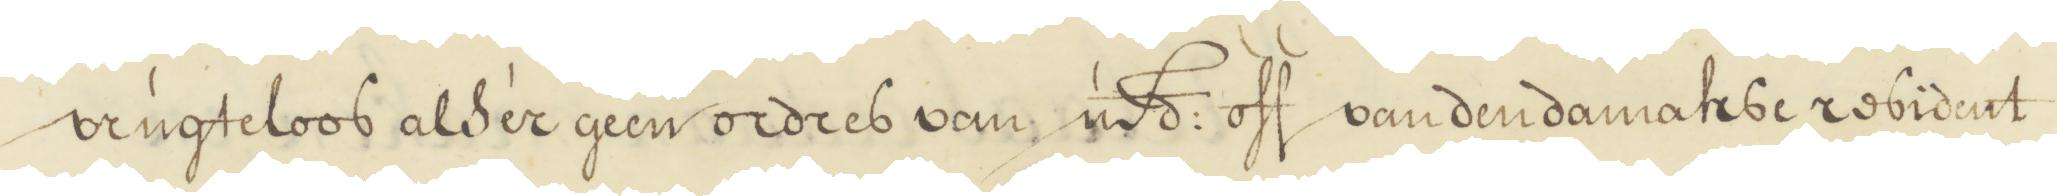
vrugteloos als 'er geen ordres van uEd: off van den damakse resident
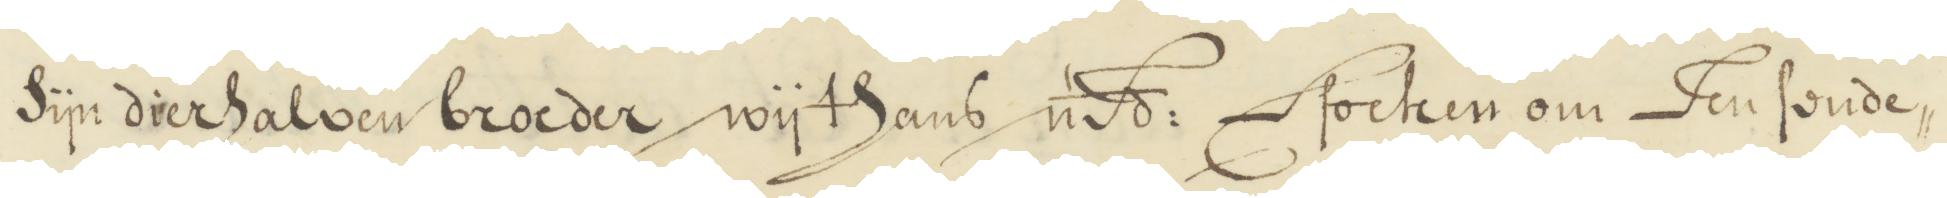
sijn dierhalven broeder wij thans uEd: versoeken om Een sende„
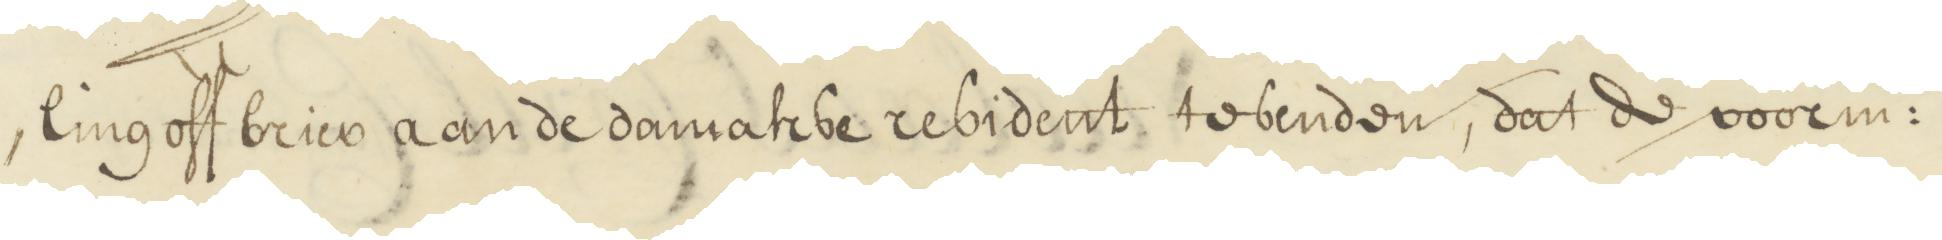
„ling off briev aan de damakse resident tesenden, dat de voorm:
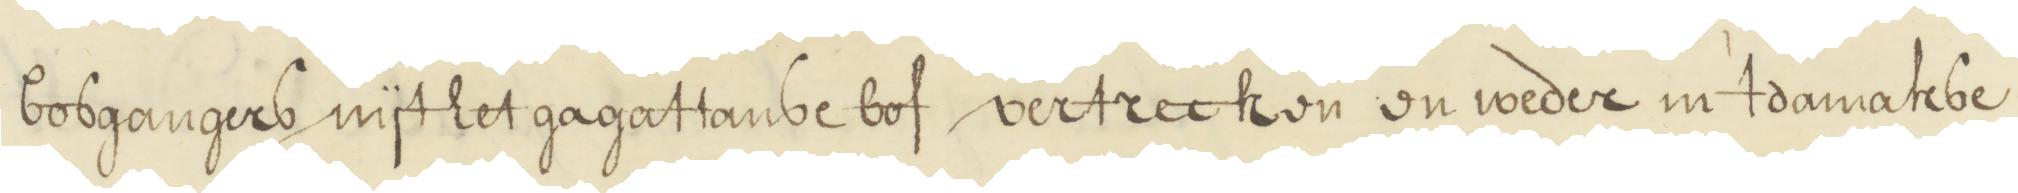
bosgangers uijt het gagattanse bof vertrecken en weder in ’t damakse
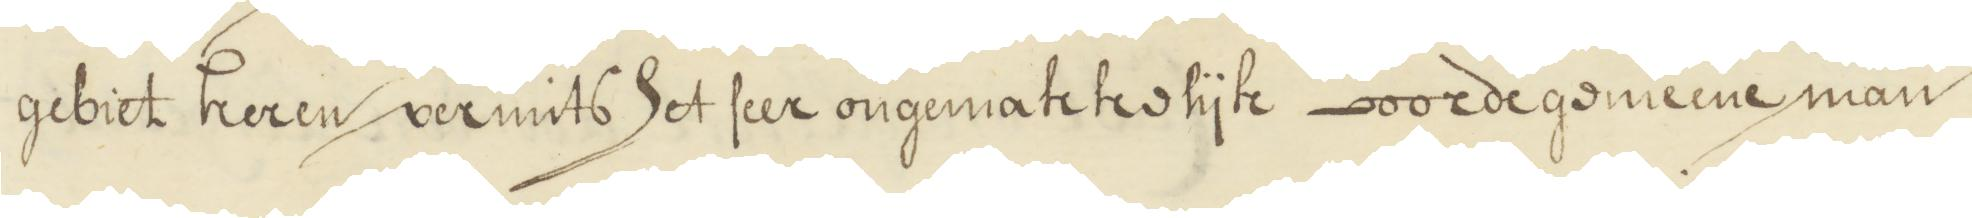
gebiet keren vermits het seer ongemakkelijk voor de gemeene man
